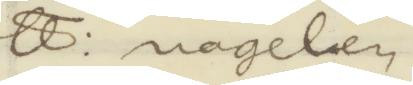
lb: nagelen
